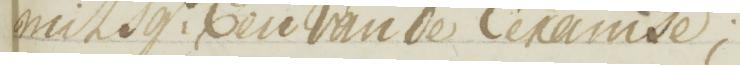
mitsg:s Een van de Ceramse;
